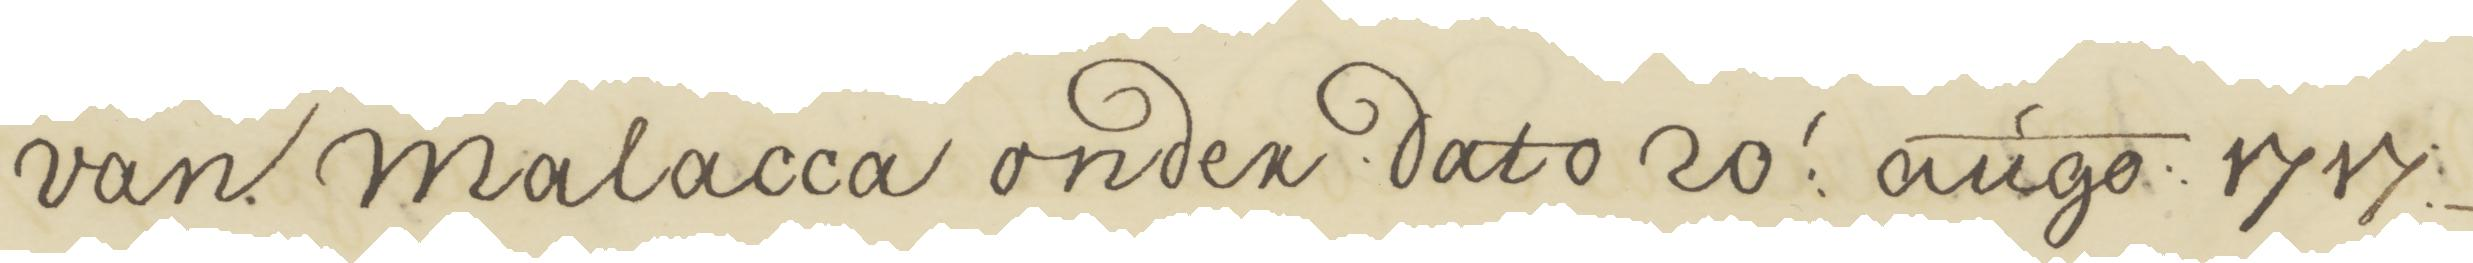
van Malacca onder dato 20:' augo: 1717:
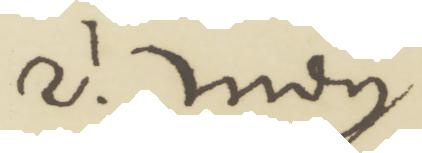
2.' meij
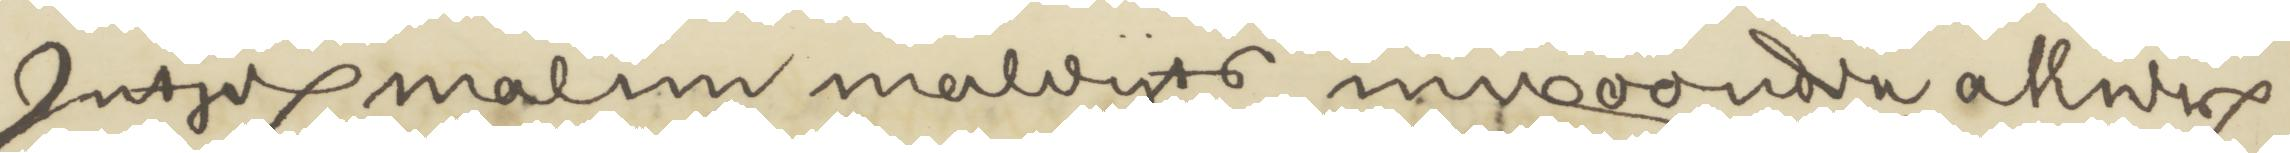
Jntje malim maleijts inwoonder alhier
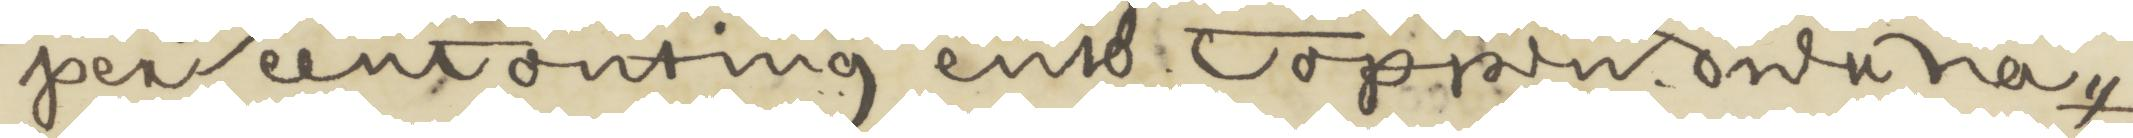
per eenconting en 18: Coppen dier na„
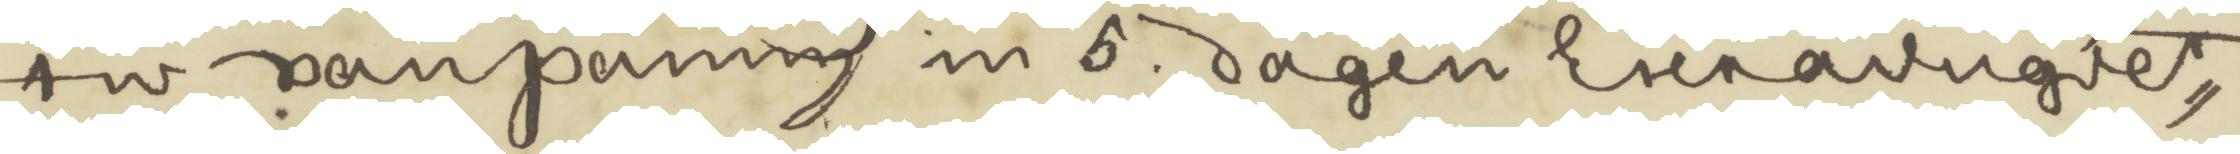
tie van pannij in 5. dagen hier aengel„t
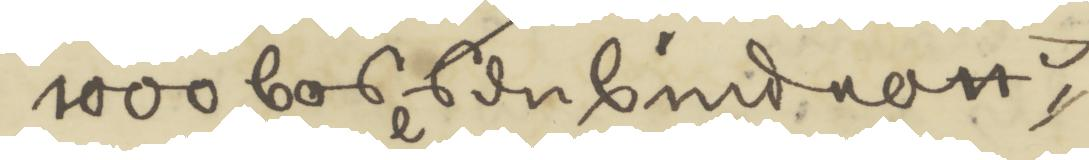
1000 bossen bindrott„s
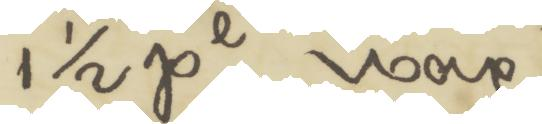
1½ p:l wax
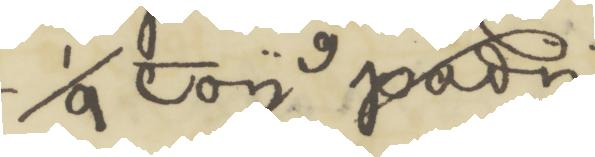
¼ Coij:g padij
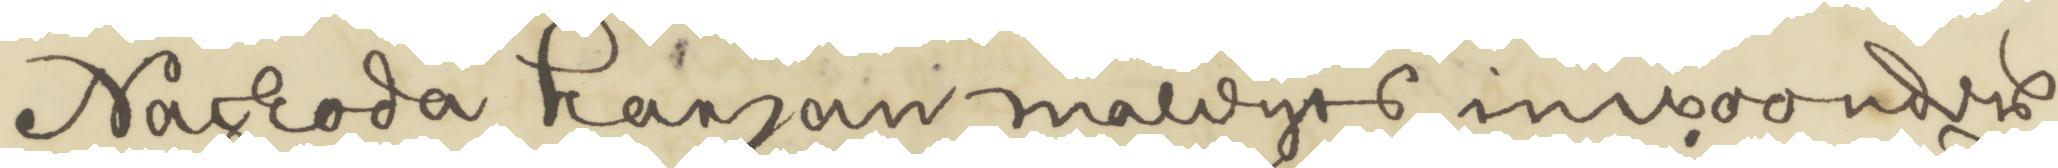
Nachoda karjan maleijts inwoonder
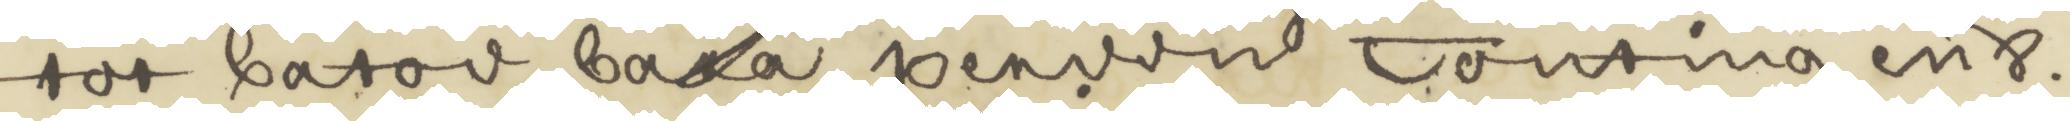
tot batoe bara pereen Conting en 8.
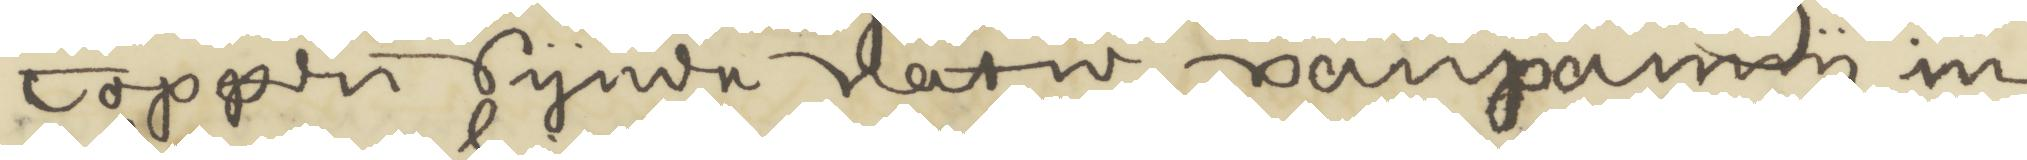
Coppen sijner natie van pannij in
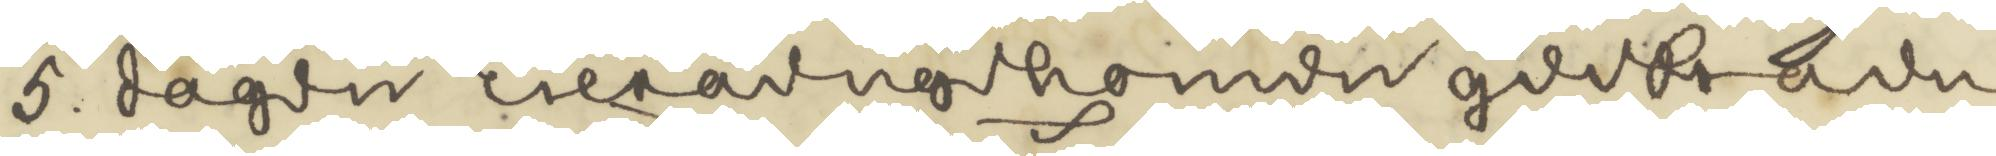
5. dagen hier aengekomen geeft aen
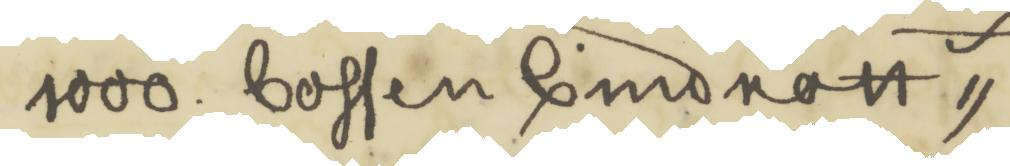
1000. bossen bindrott„s
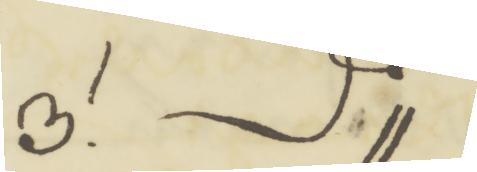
3.' D„o
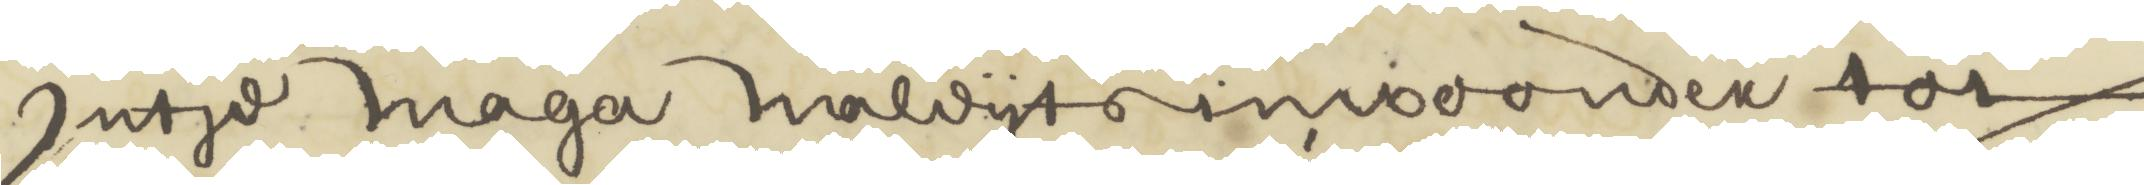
Intje maga maleijts inwoonder tot
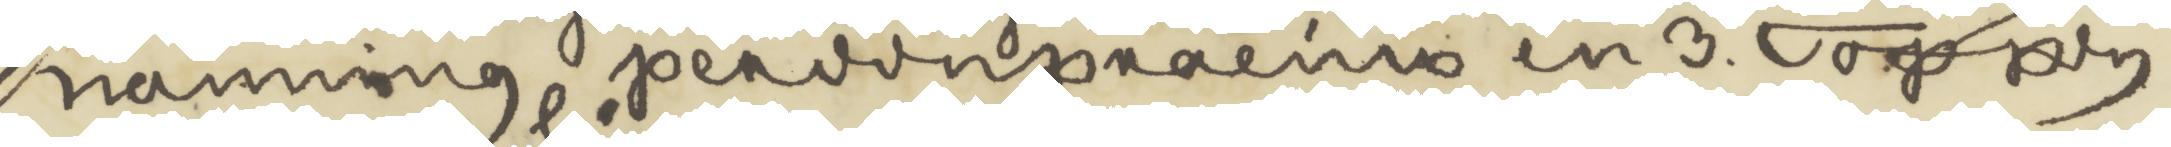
nanning pereenpraeuw en 3. Coppen
